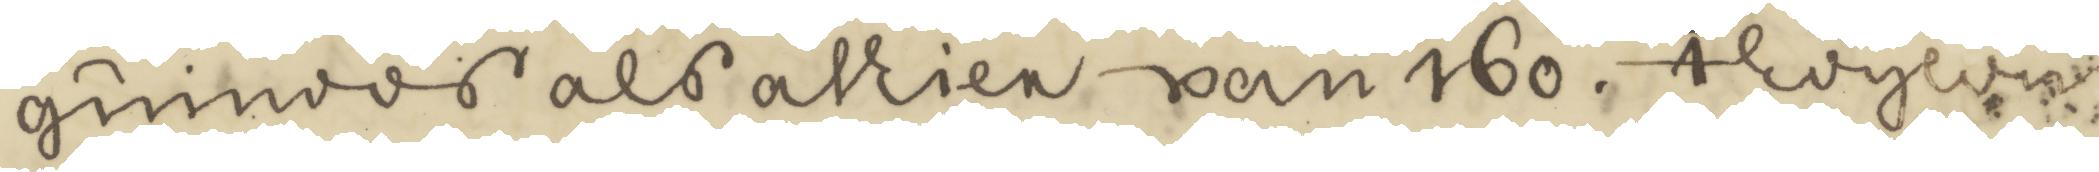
guinees als alhier van 160. theijlen
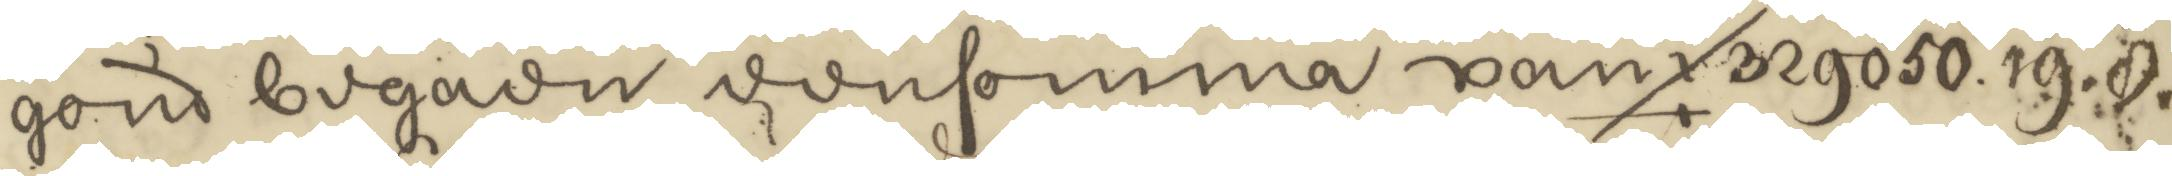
goud begaen een somma van ƒ329050.19.8.
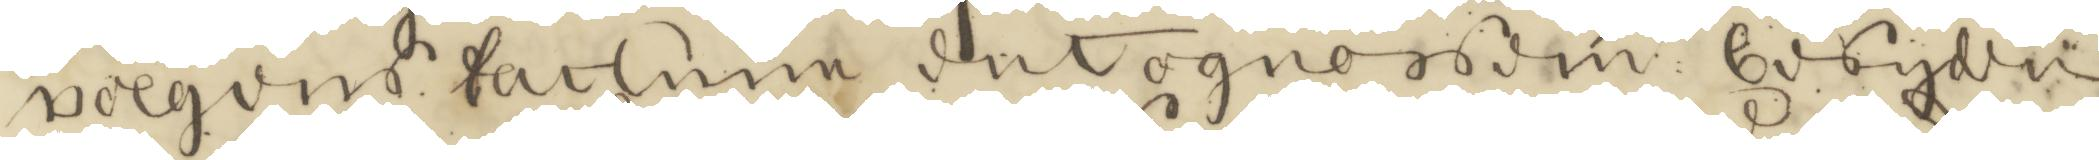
volgens factum en cognossem:t besijden
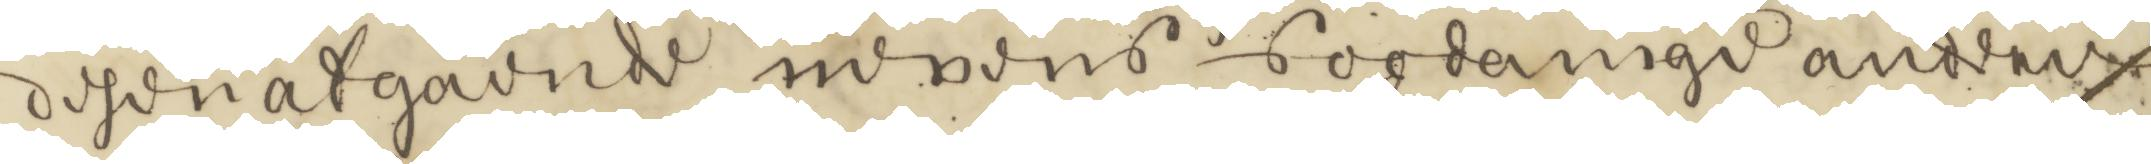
desen afgaende nevens soodanige anderen
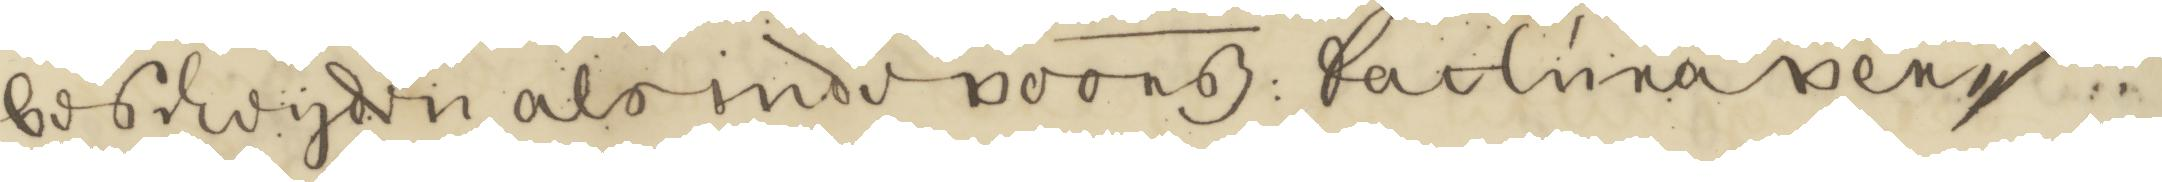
bescheijden als inde voors: factura ver„
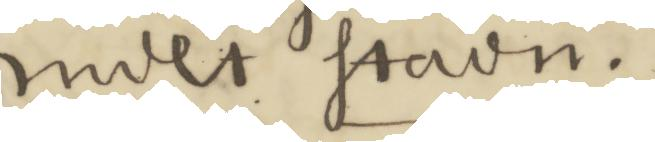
melt staen.
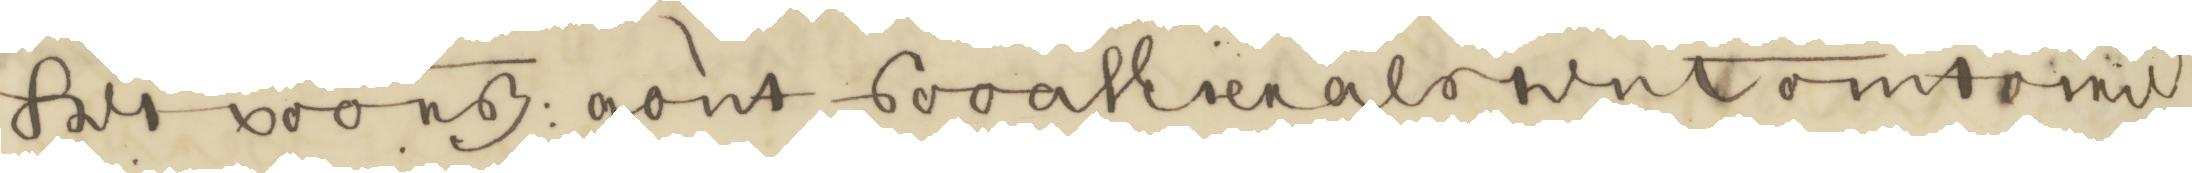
Het voors: gout soo alhier als ten Comtoire
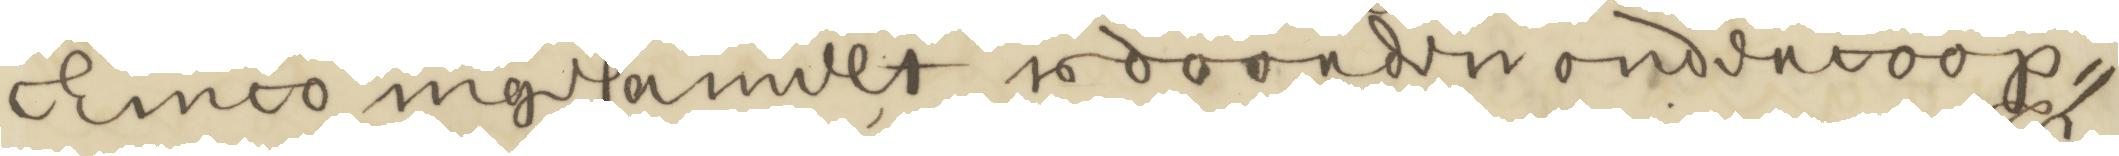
Chinco ingesamelt is door den ondercoop„
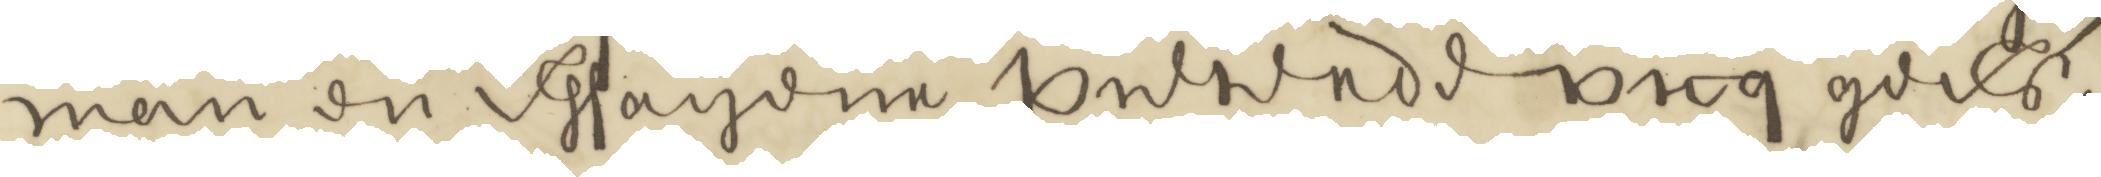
man en Essaijeur Pieter de Vicq geEs„
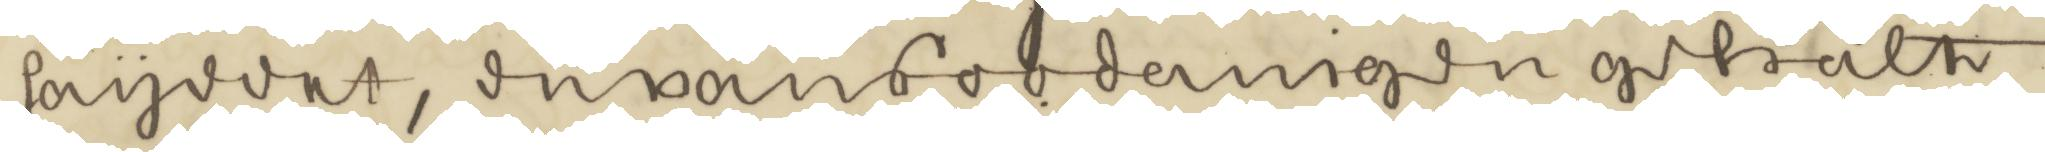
saijeert, en van soodanigen gehalte
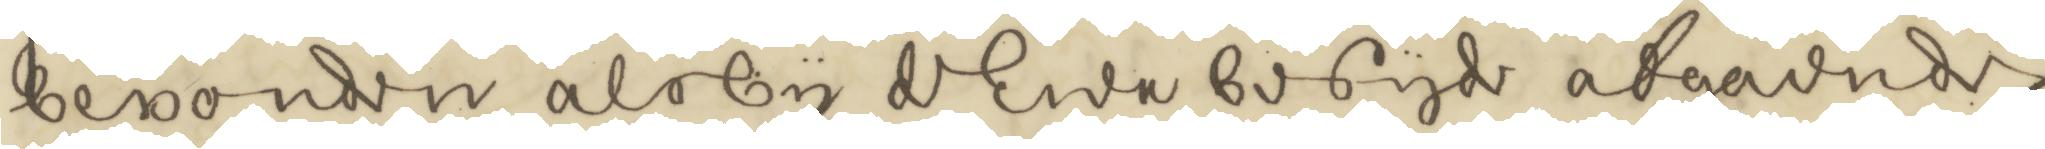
bevonden als bij de hier besijde afgaende
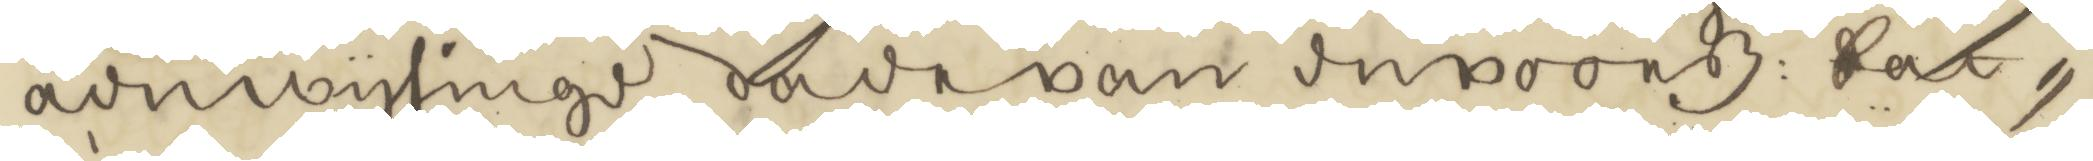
aenwijsinge daervan en voors: fac„
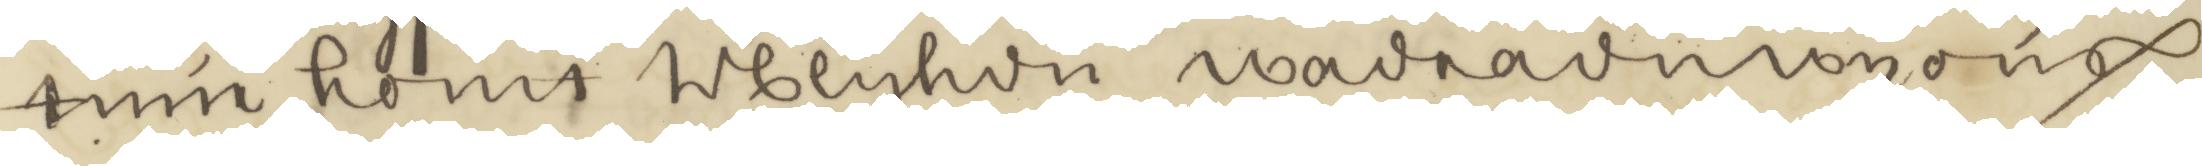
tuur komt teblijken waeraen wij ons
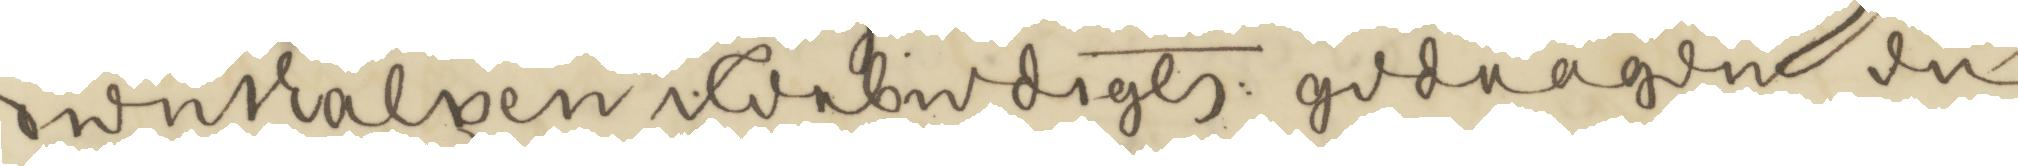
dienthalven Eerbiedigh: gedrage en
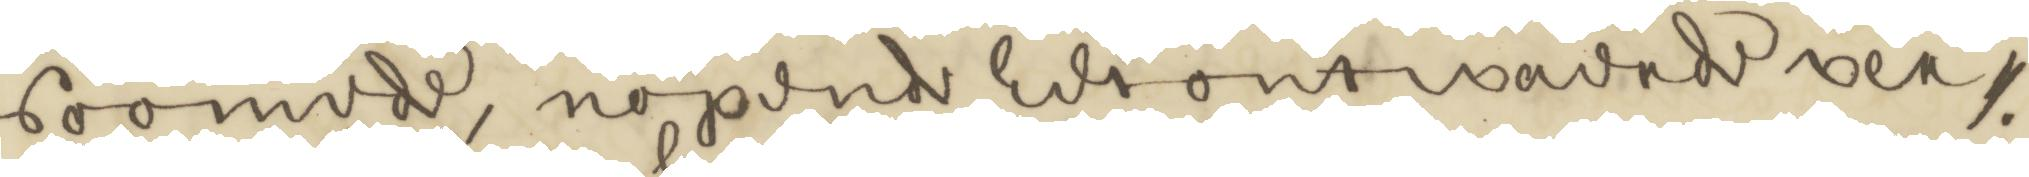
soomede, nopende het ontwaerde ver„
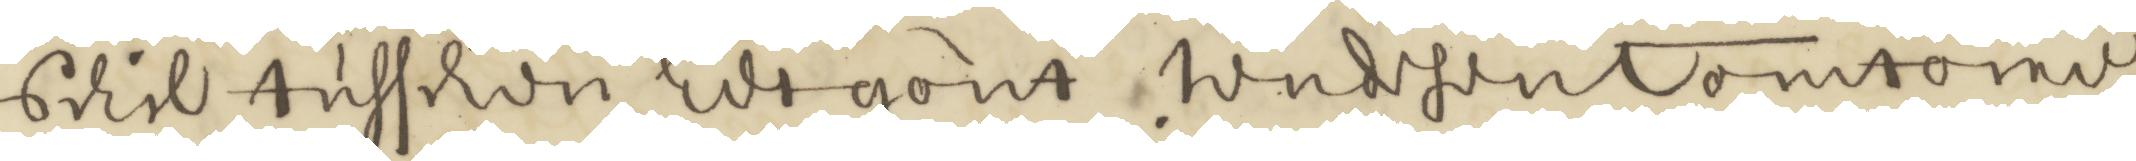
schil tusschen het gout ten desen Comtoire
